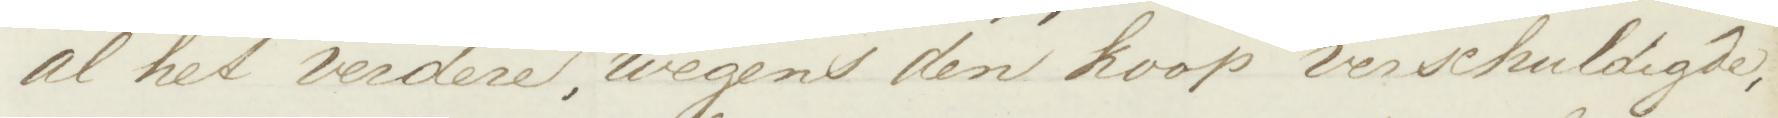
al het verdere, wegens den koop verschuldigde,
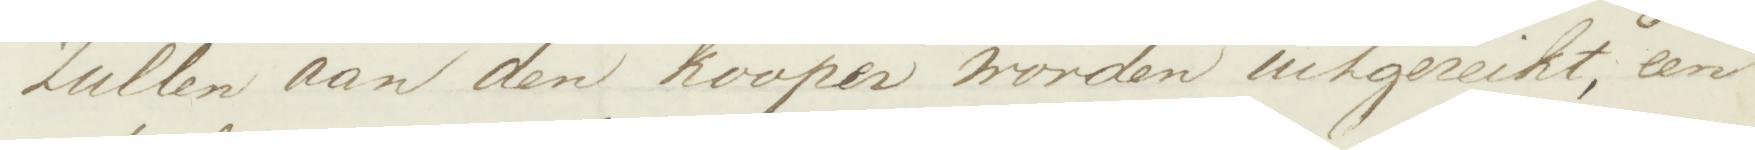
zullen aan den kooper worden uitgereikt, een
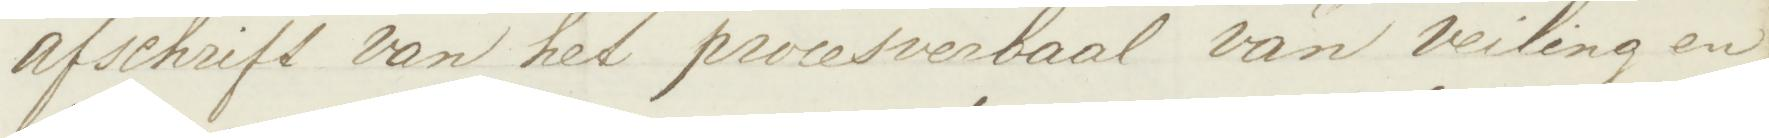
afschrift van het procesverbaal van veiling en
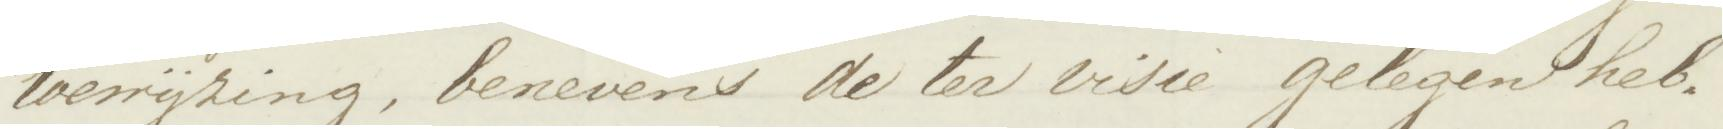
toewijzing, benevens de ter visie gelegen heb„
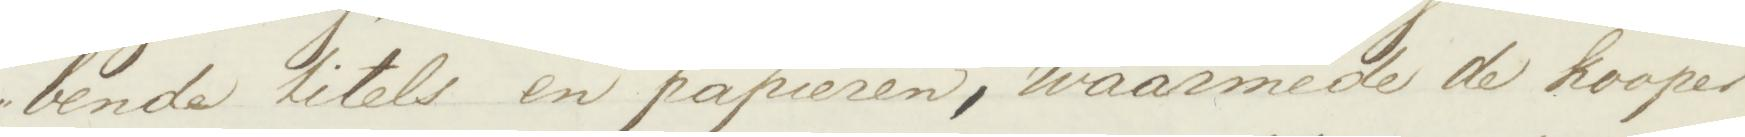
„bende zitels en papieren, waarmede de kooper
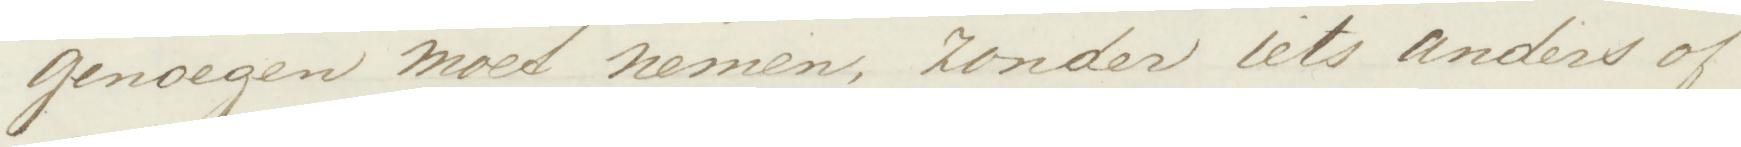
genoegen moet nemen, zonder iets anders of
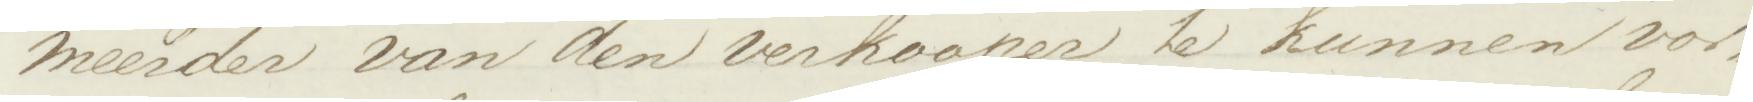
meerder van den verkooper te kunnen vor„
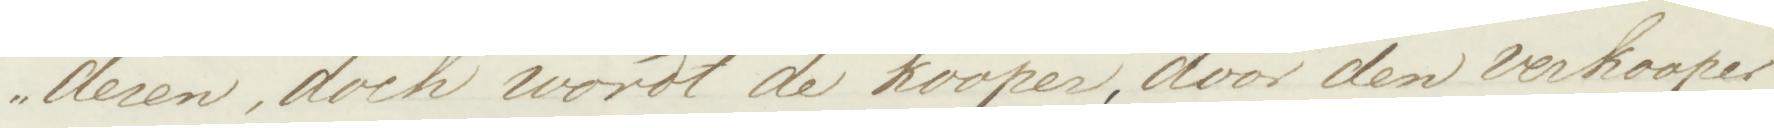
„deren, doch wordt de kooper, door den verkooper
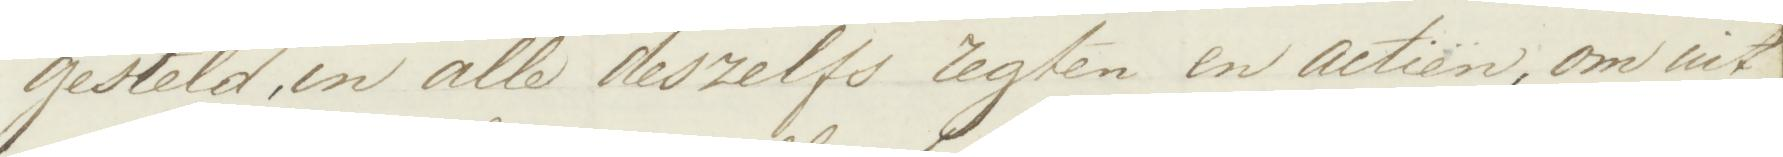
gesteld, in alle deszelfs regten en actiën, om uit
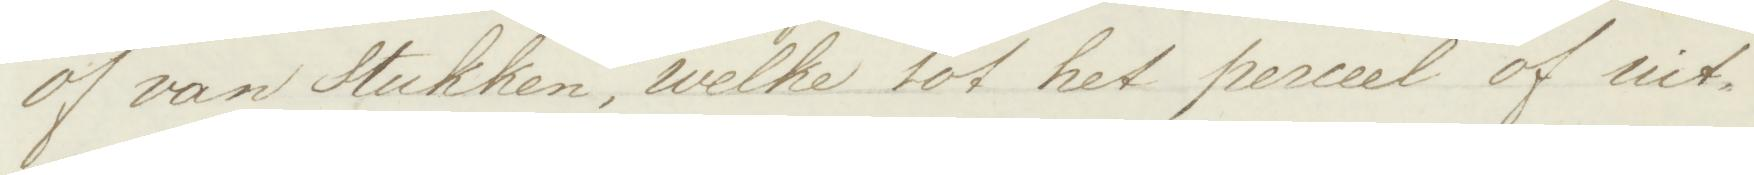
of van stukken, welke tot het perceel of uit„
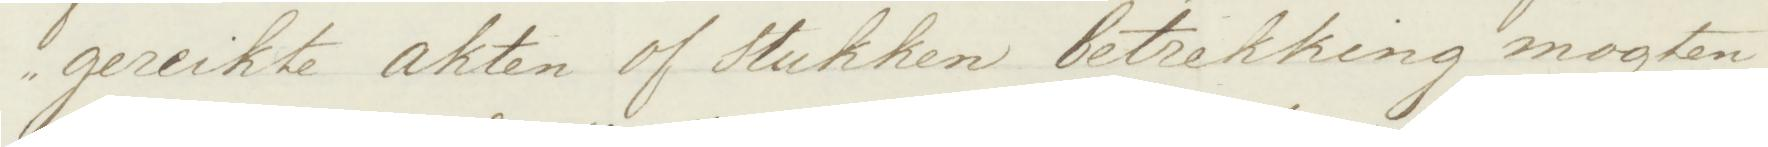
„gereikte akten of stukken betrekking mogten
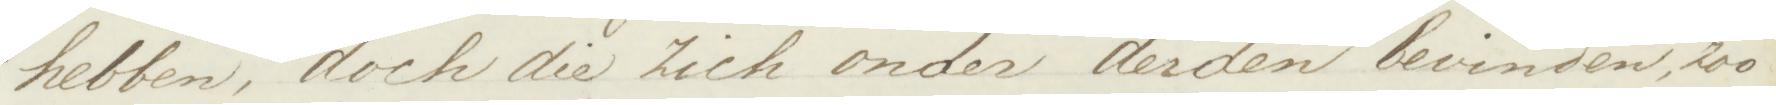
hebben, doch die zich onder derden bevinden, zoo
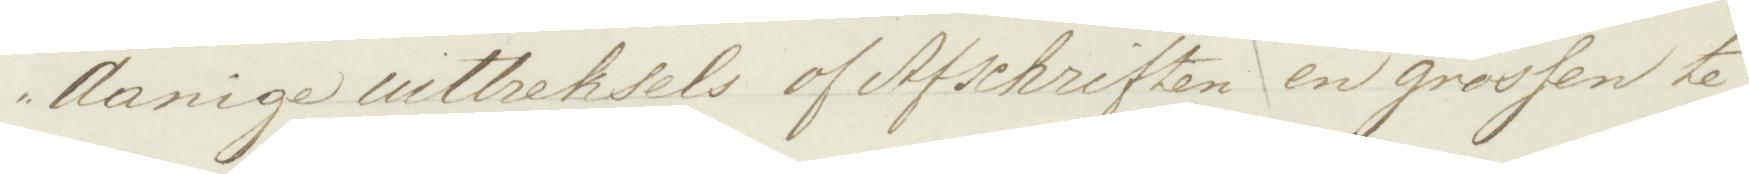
„danige uittreksels of Afschriften en grossen te
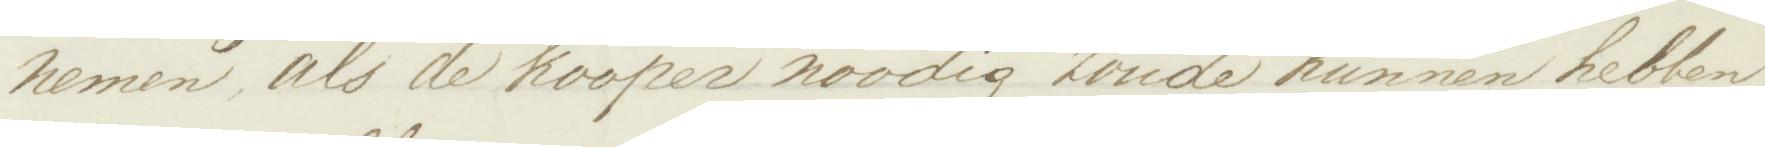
nemen, als de kooper noodig zoude kunnen hebben,
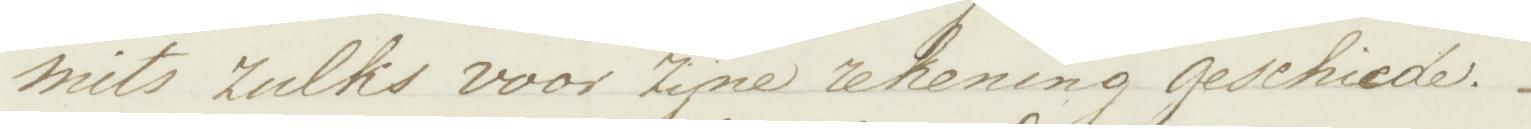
mits zulks voor zijne rekening geschiede. —
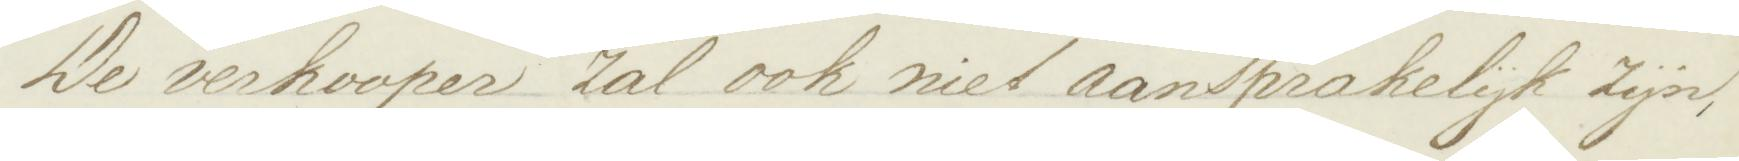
De verkooper zal ook niet aansprakelijk zijn,
